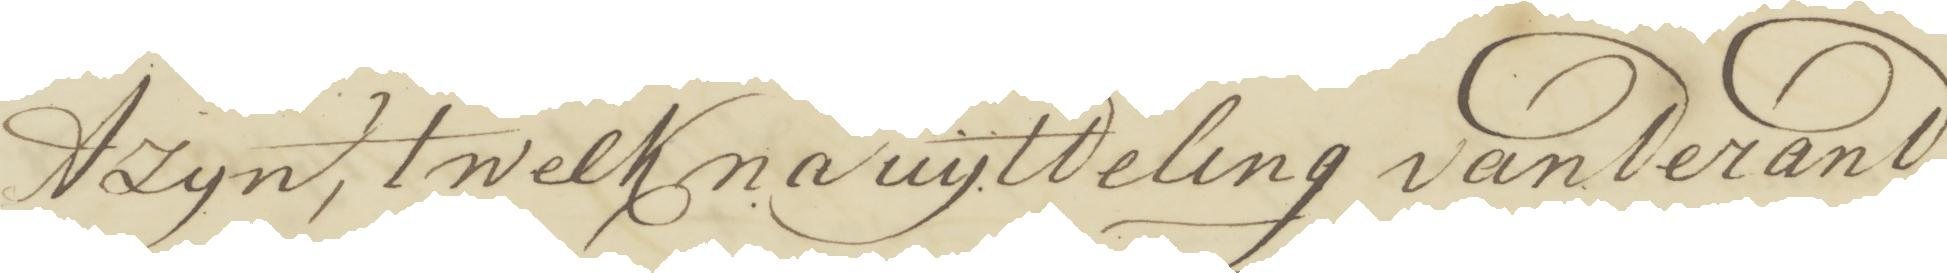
t zijn, t welk na uijtdeling van de rand
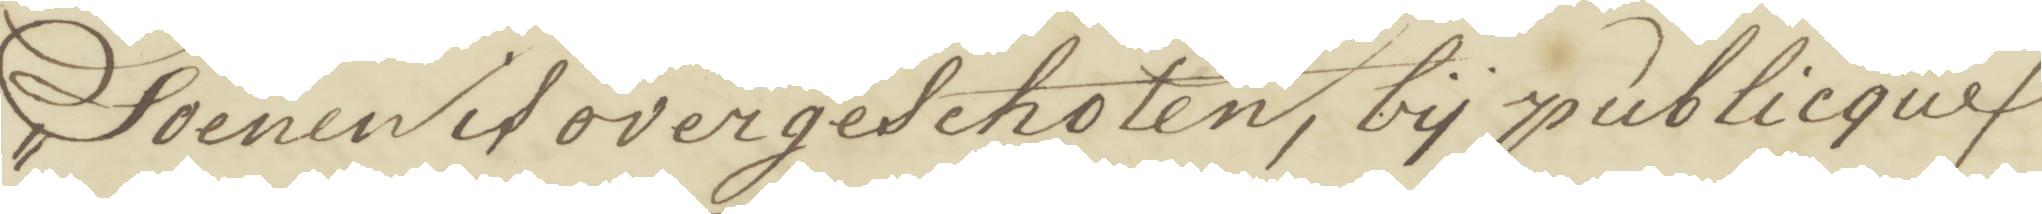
„Soenen is overgeschoten, bij publicque
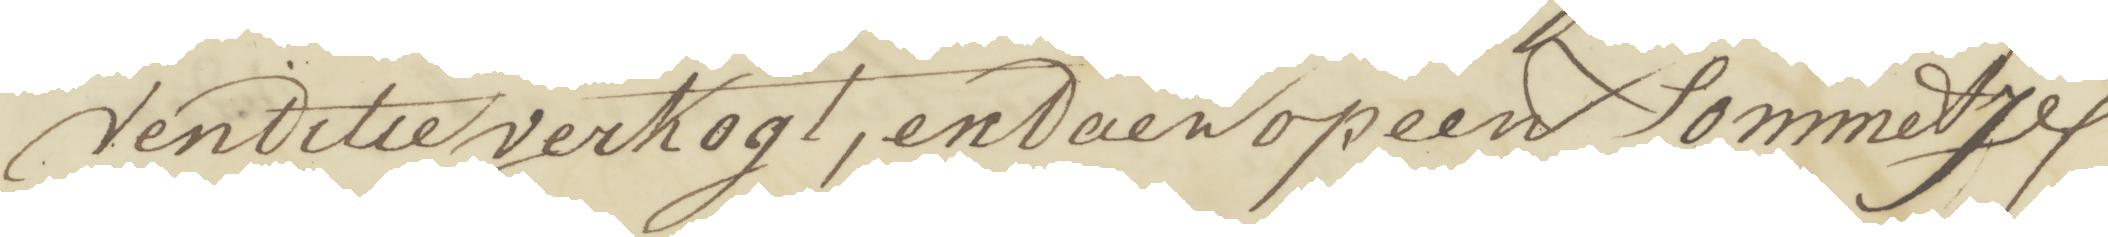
venditie verkogt, en daer op een Sommetje
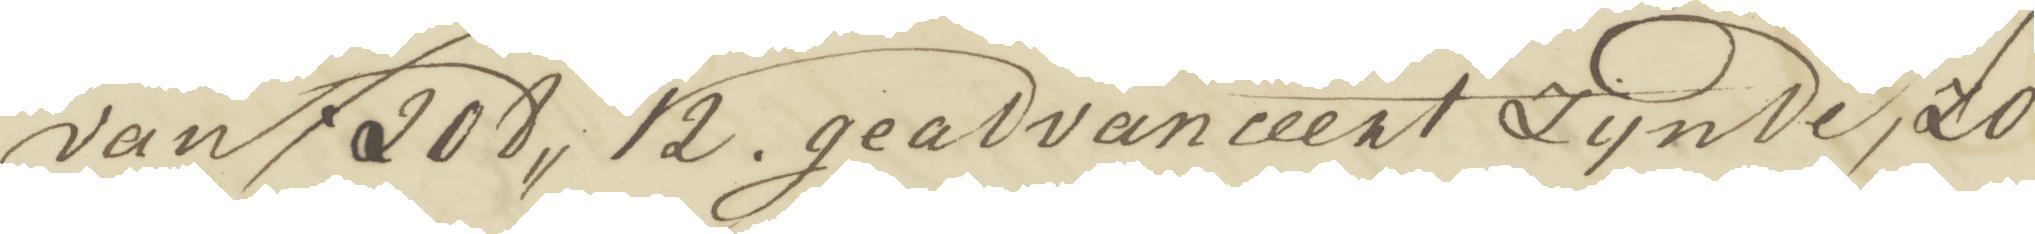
van ƒ 208„12. geadvanceert zijnde, zo
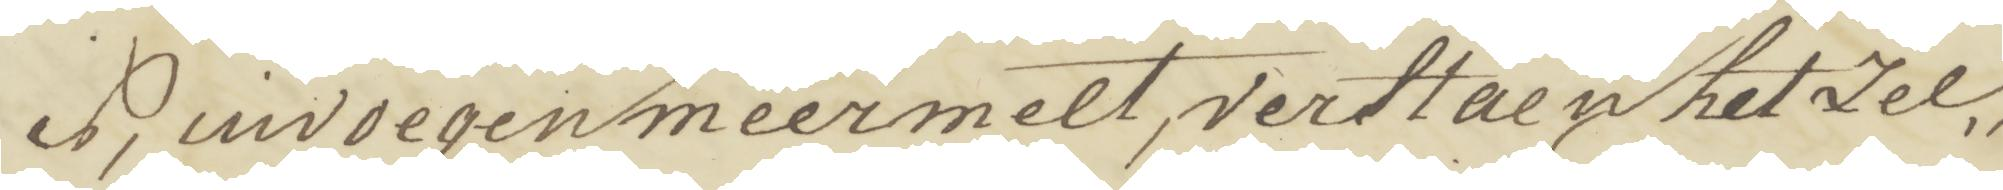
is, invoegen meermelt, verstaen het zel„
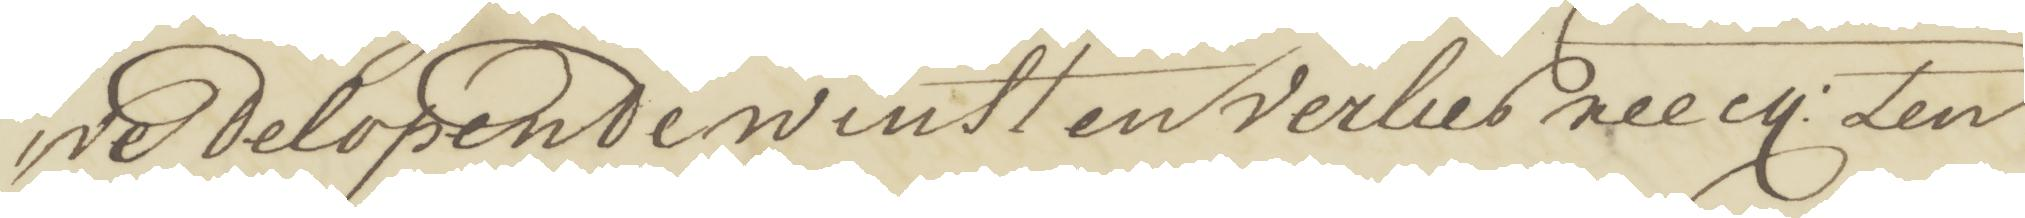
„ve de lopende winst en verlies reecq: ten
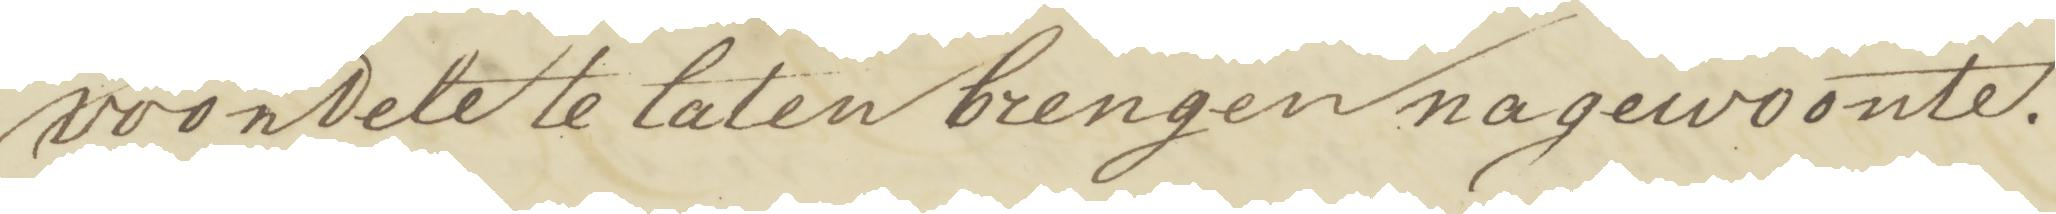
voordele te laten brengen na gewoonte.
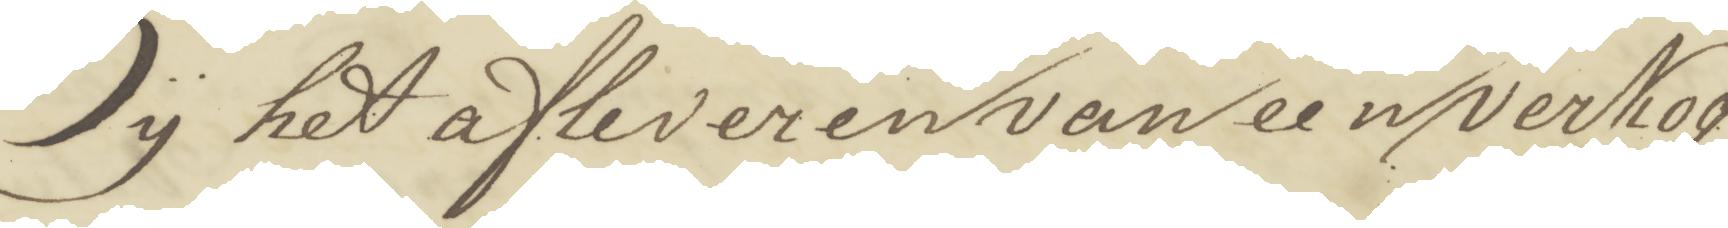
Bij het afleveren van een verkog
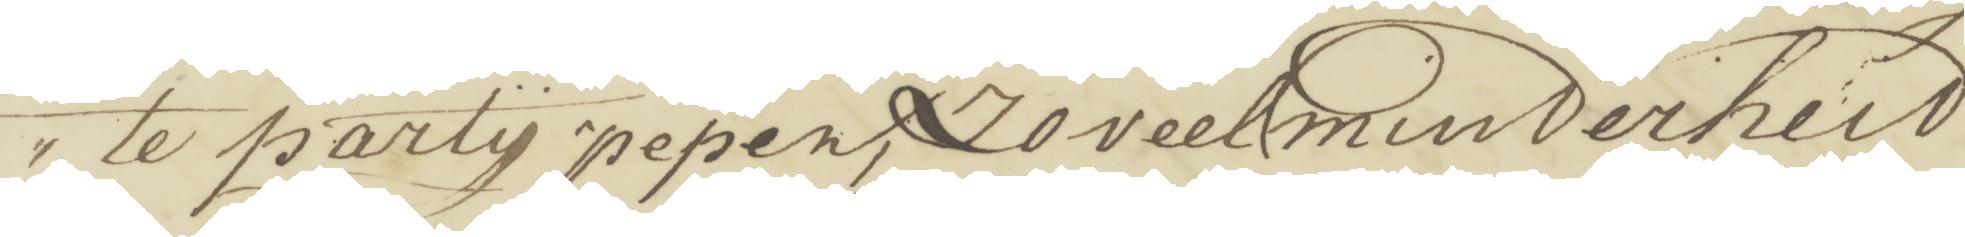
„te partij peper, Zo veel minderheid
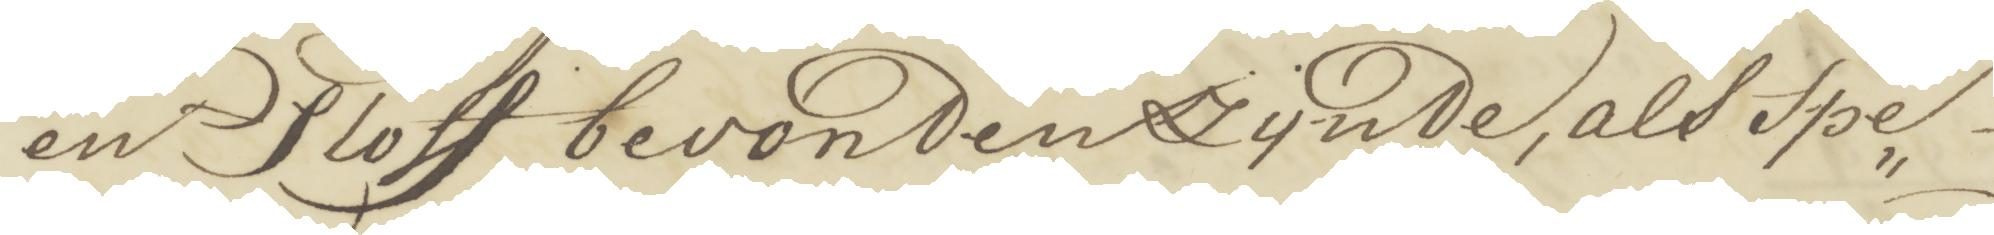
en Stoff bevonden Zijnde, als spe„
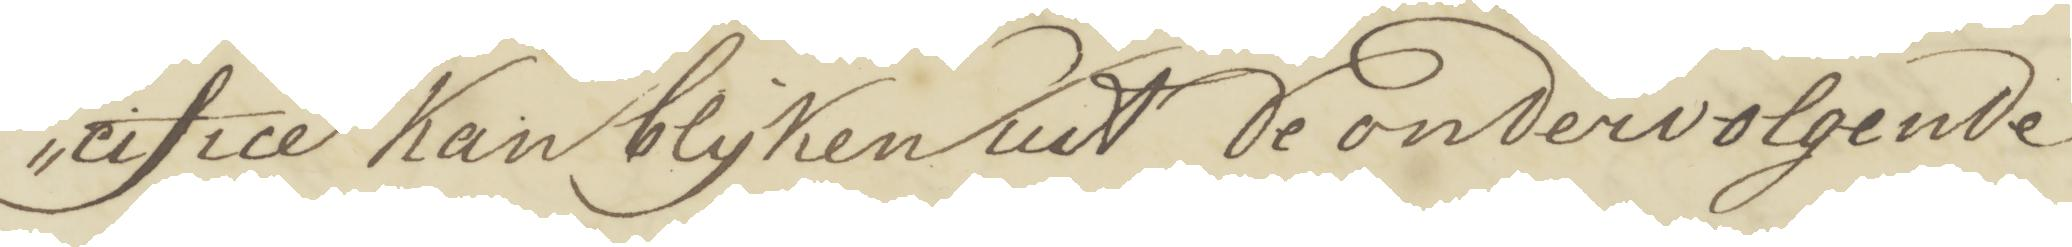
„cifice Kan blijken uit de ondervolgende
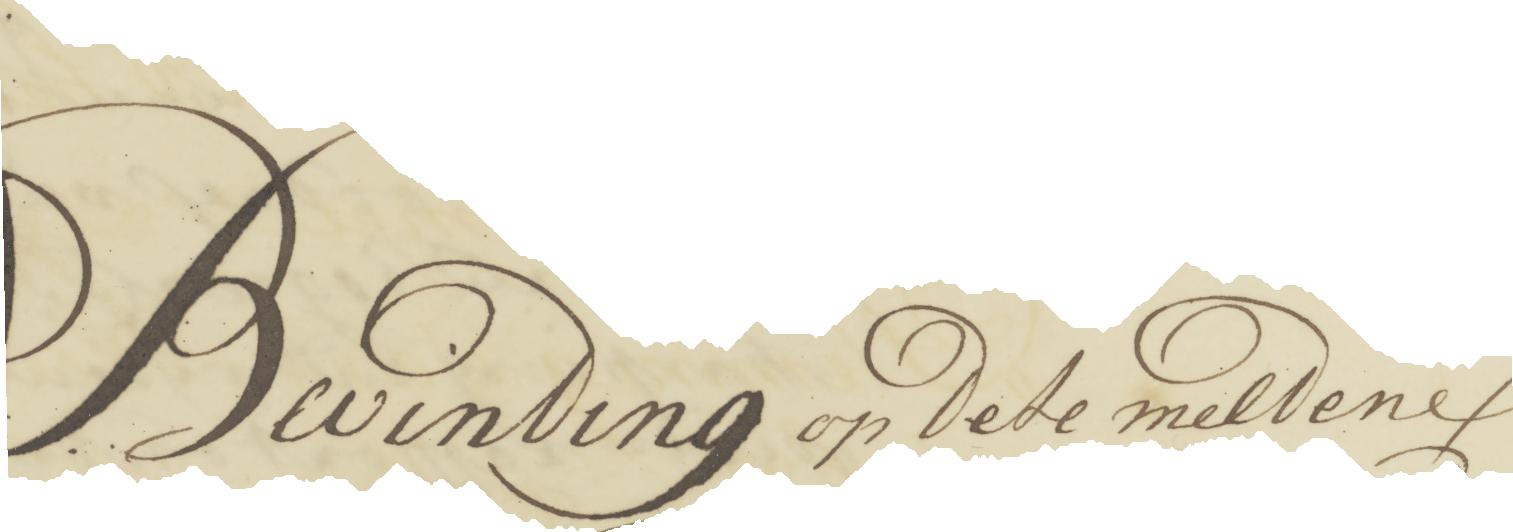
Bevinding op de te meldene
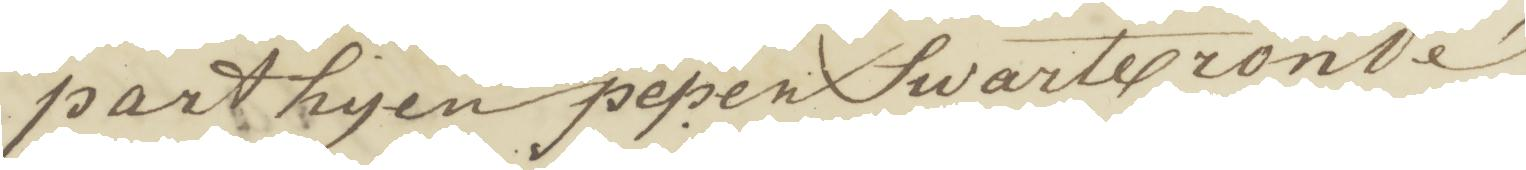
parthijen peper Swarte ronde
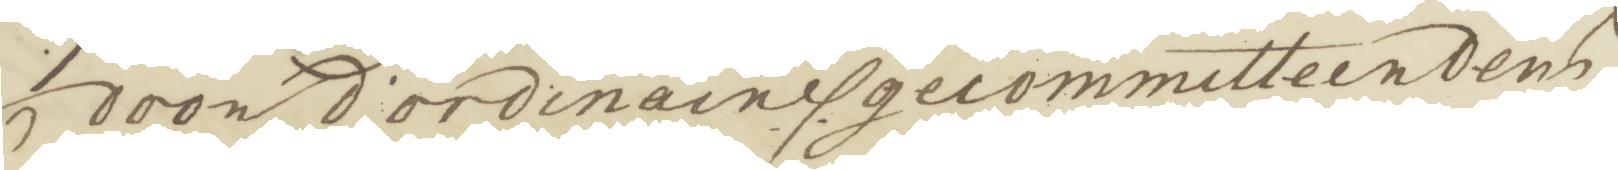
door d’ordinaire gecommitteerdens
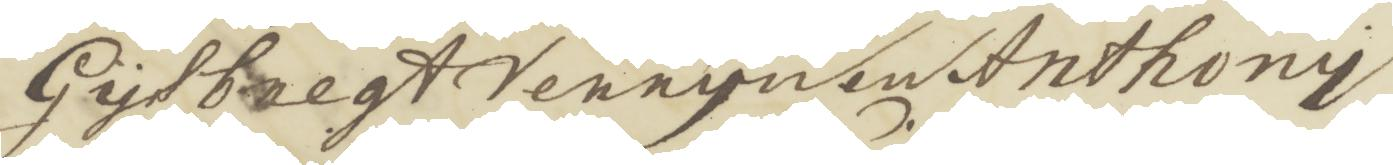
Gijsbregt Verrijn en Anthonij
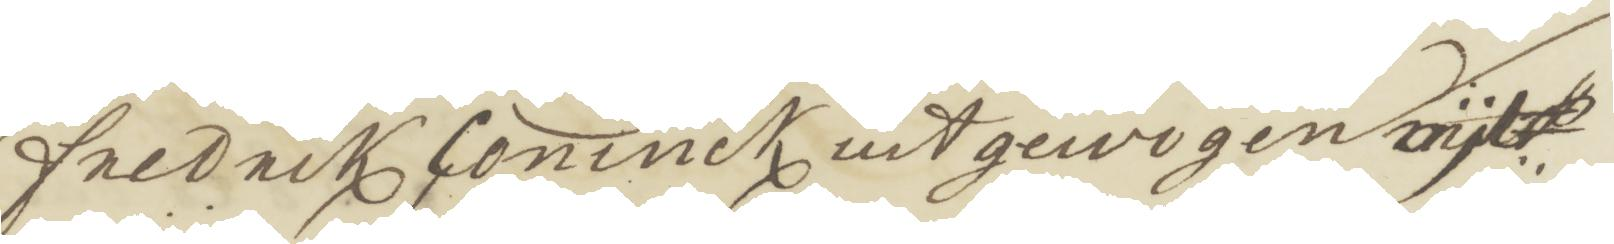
fredrik Coninck uit gewogen uijt
